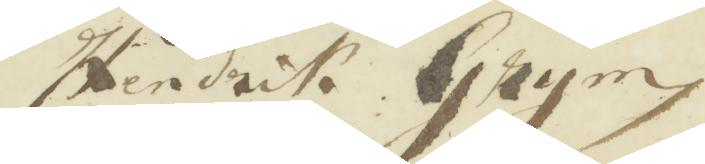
Hendrik Grym
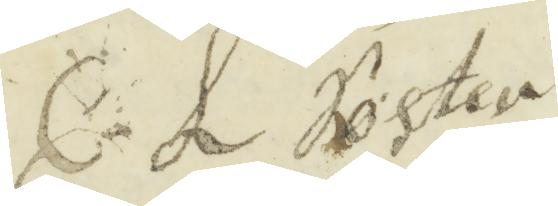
C L Koster
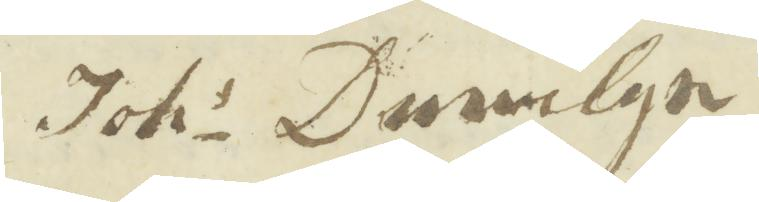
Joh=s Dumelyn
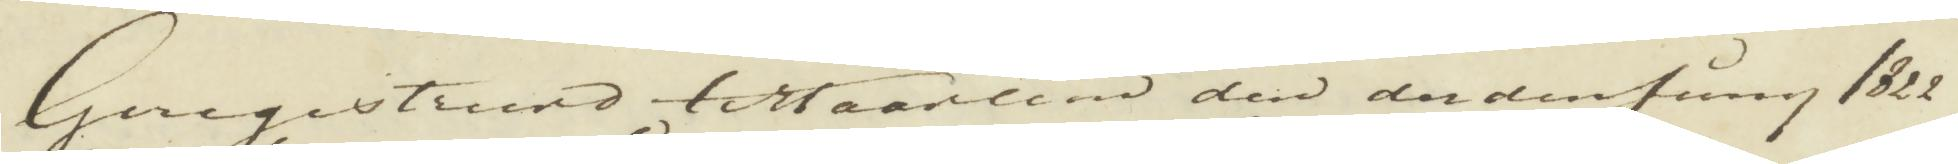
Geregistreerd te Haarlem den derden Juny 1822
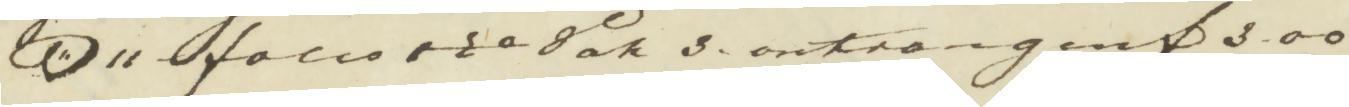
D11 folio 1 r-o Vak 3. ontvangen ƒ3.00
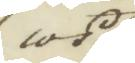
10 pct
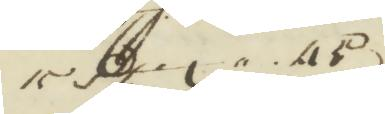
15 pct „ .45
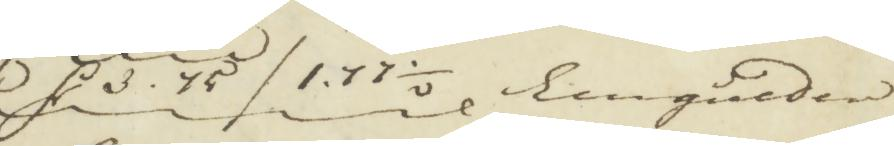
ƒ 3 . 75 ƒ 1.77 ½ Een gulden
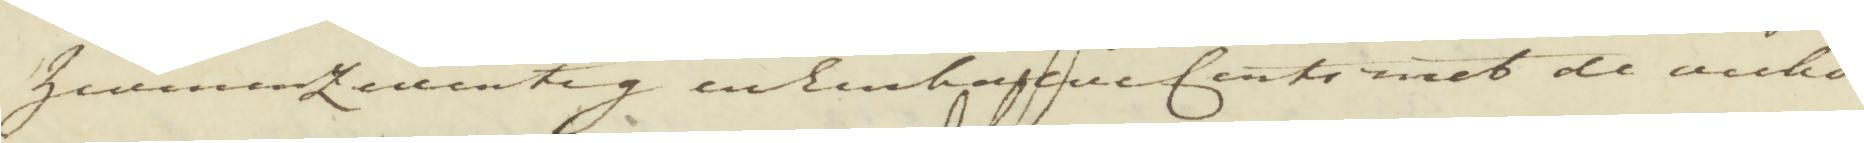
ZevenenZeventig enEenhalve Cents met de verho
